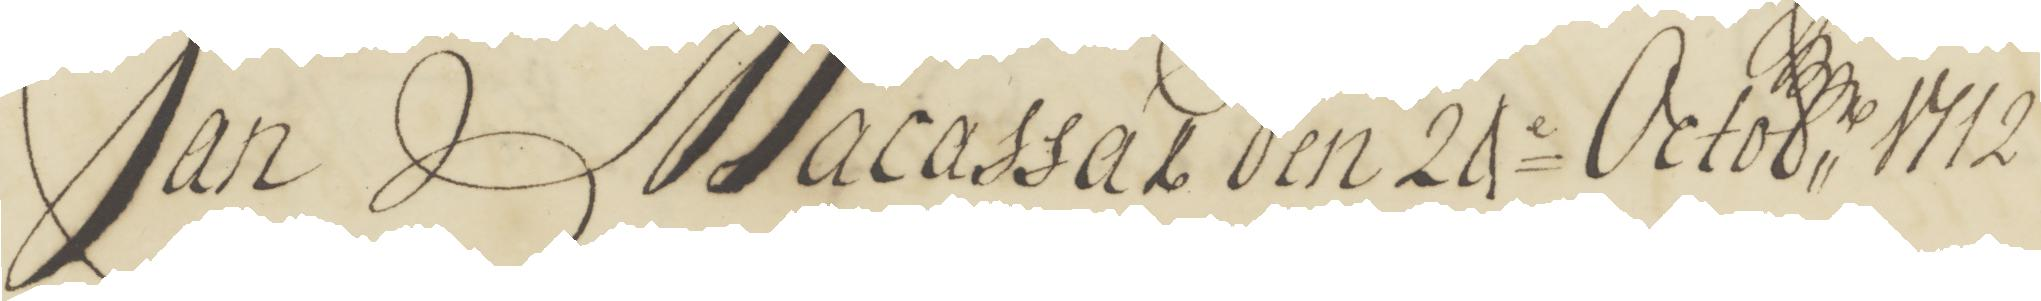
Van Macassar den 24=e Octob„r 1712
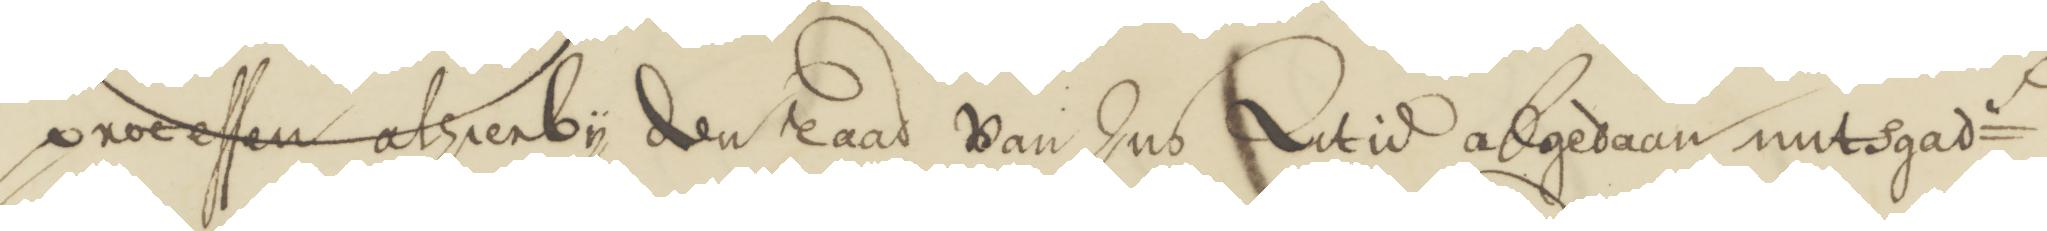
processen alhier bij den raad van Justitie afgedaan mitsgad=s
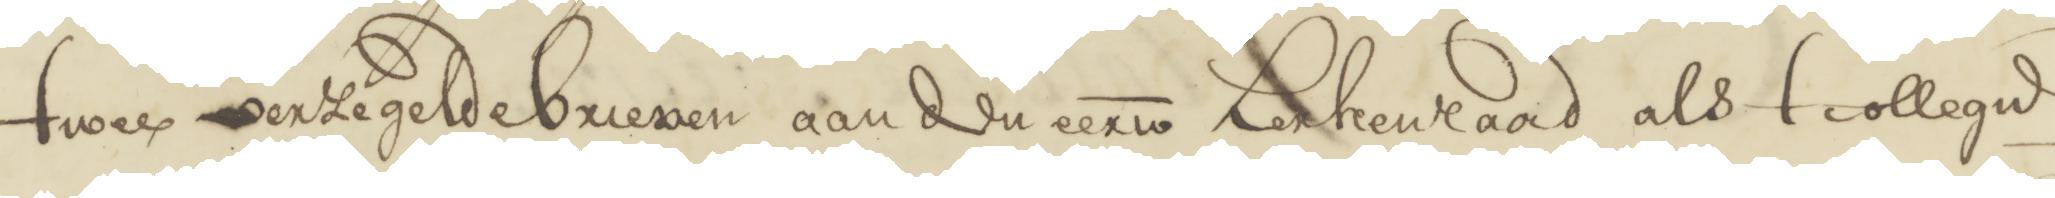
twee verzegelde brieven aan den eerw kerkenraad als t collegie
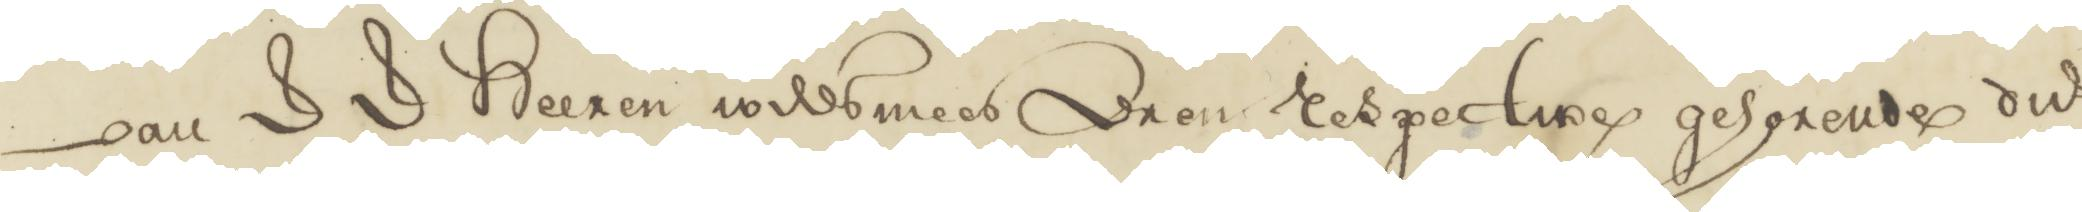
van E E Heeren weesmeesteren respective gehorende die
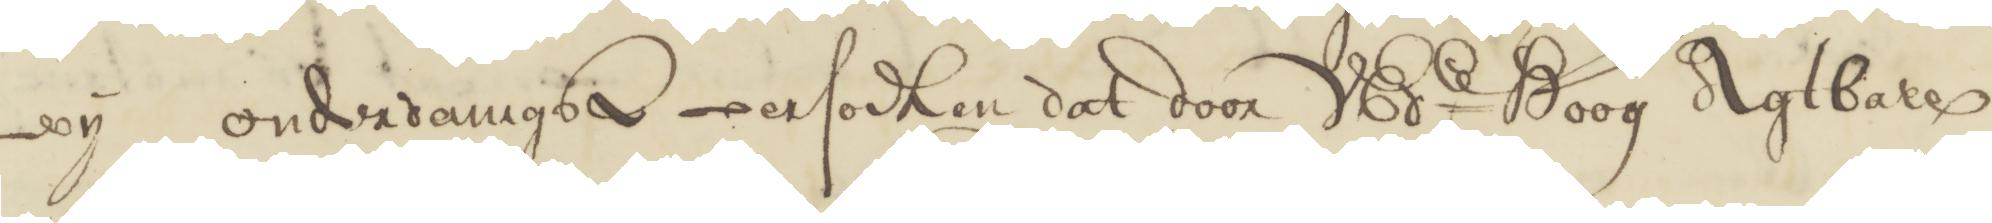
wij onderdanigst versoeken dat door VEd=le Hoog Agtbare
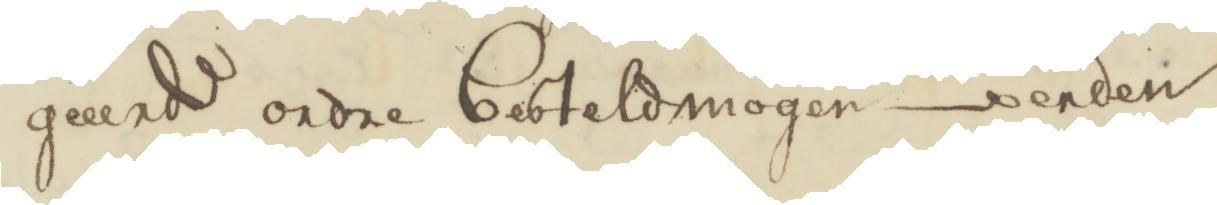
geeerde ordre besteld mogen werden
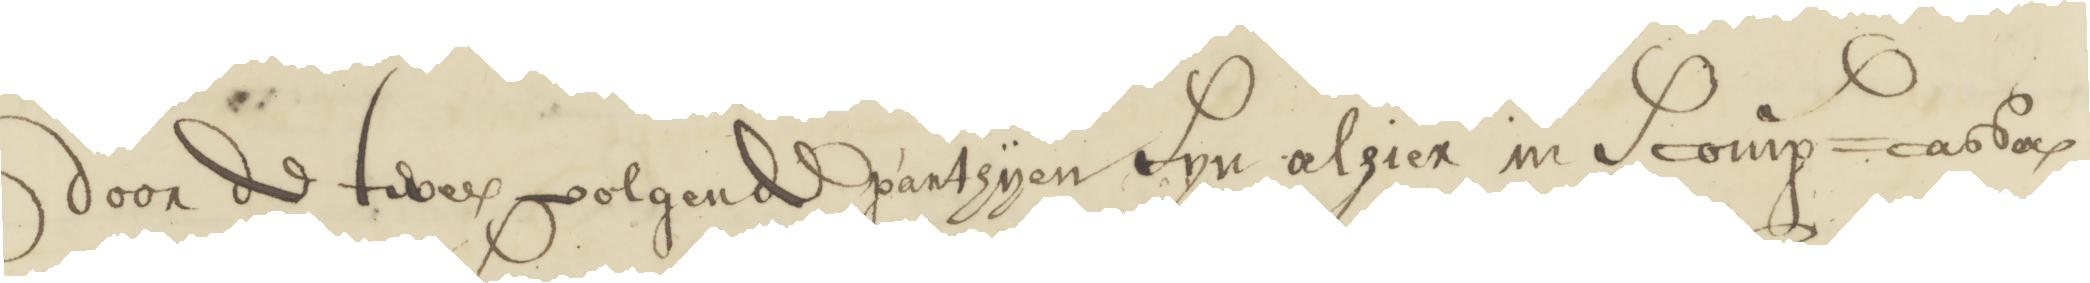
door de twee volgende parthijen syn alhier in scomp=s cassa
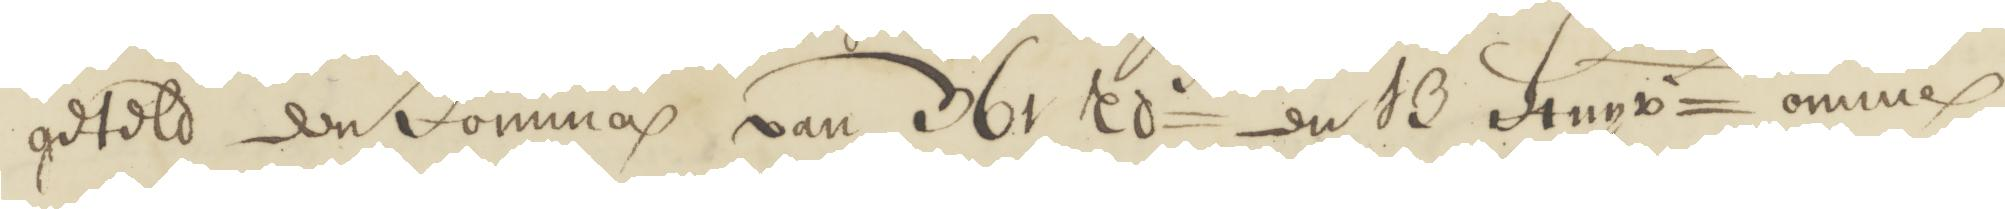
geteld een somma van 361 rd=s en 13 stuyv= omme
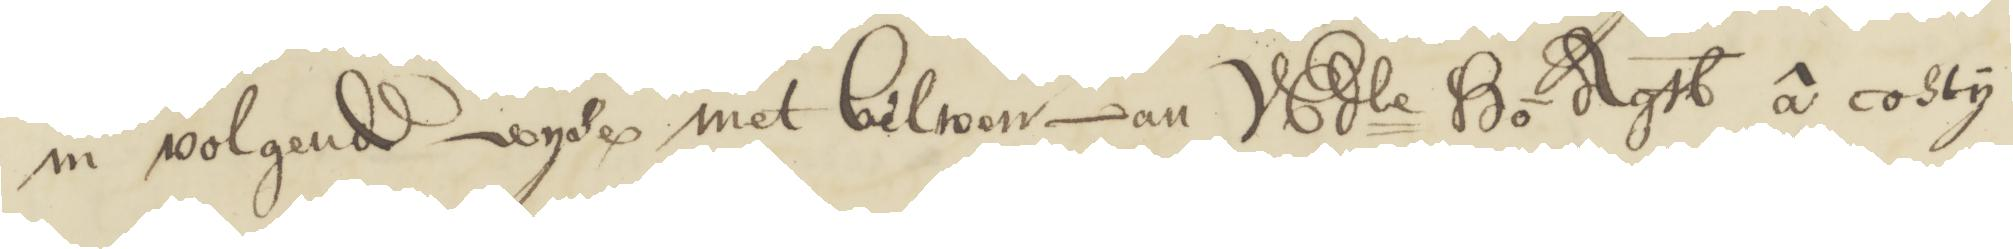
in volgende wijse met bilwen van VEd=le Ho Agtb â costij
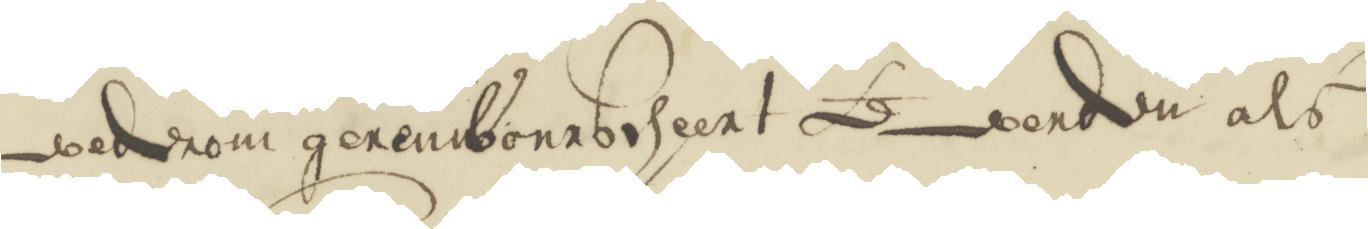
wederom gerembourscheert te werden als
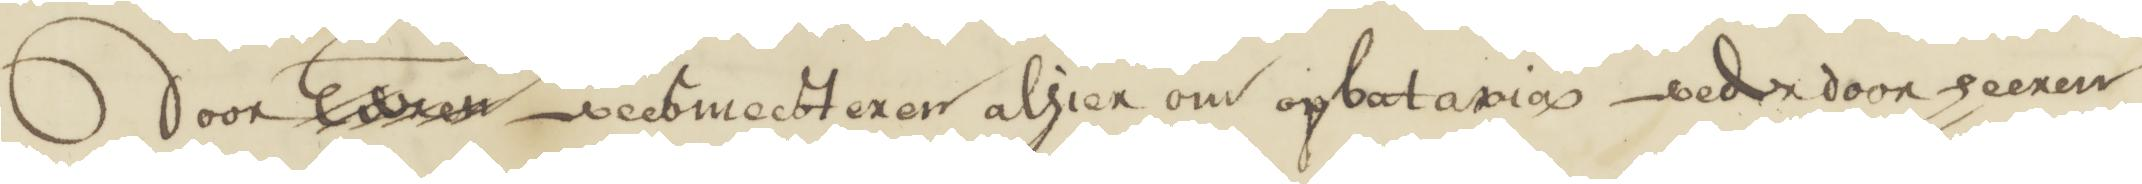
door heeren weesmeesteren alhier om op batavia weder door heeren
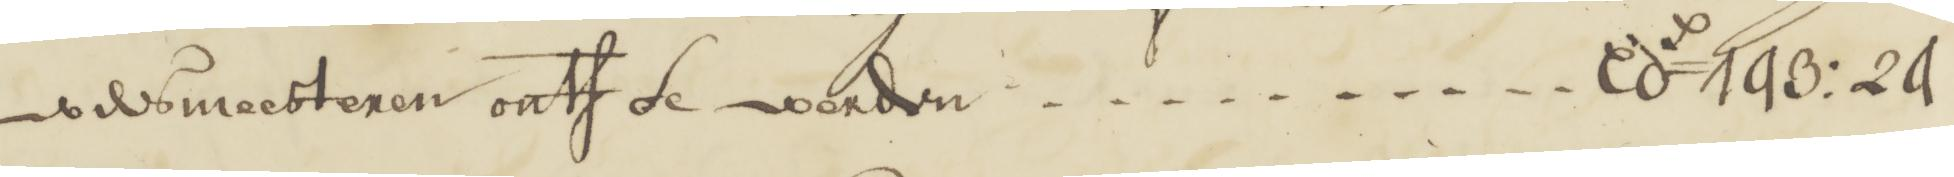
weesmeesteren ontf te werden- - - - - - - - - - rd=s 143:24
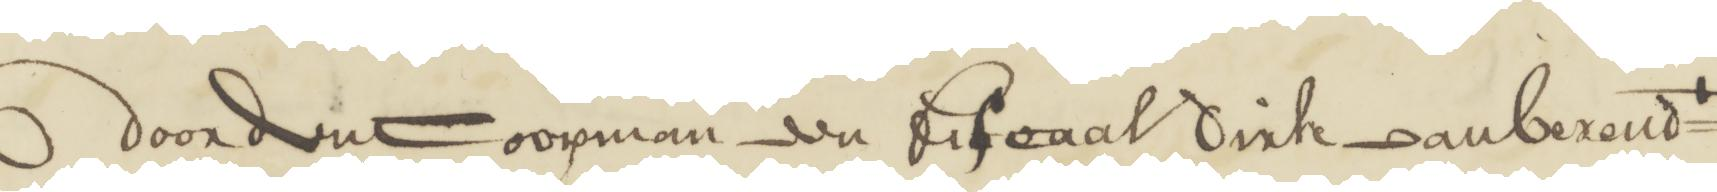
door den Coopman een fiscaal dirk van berend=t
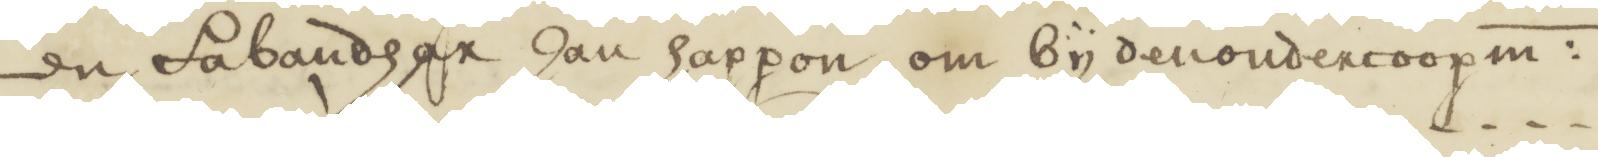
en sabandhar Jan happon om bij den ondercoopm:
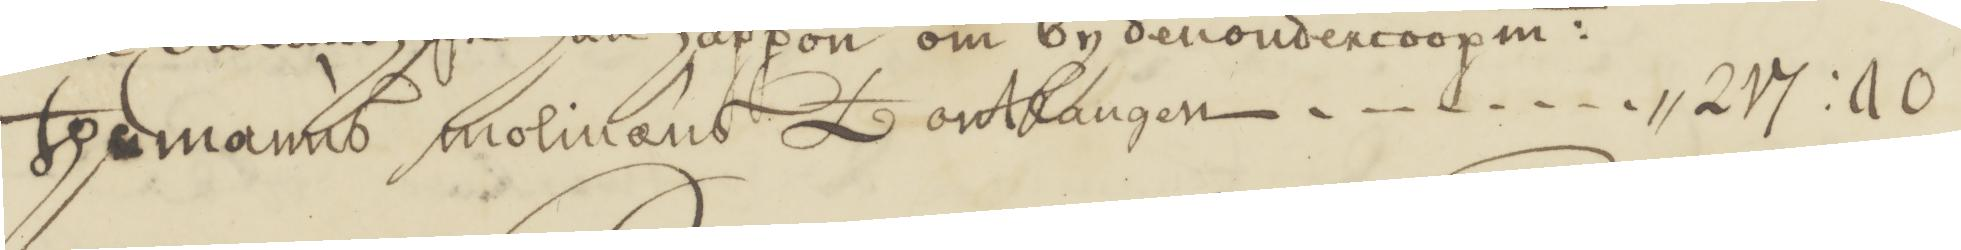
themanus molinaus te ontfangen - - - - - - - „217:40
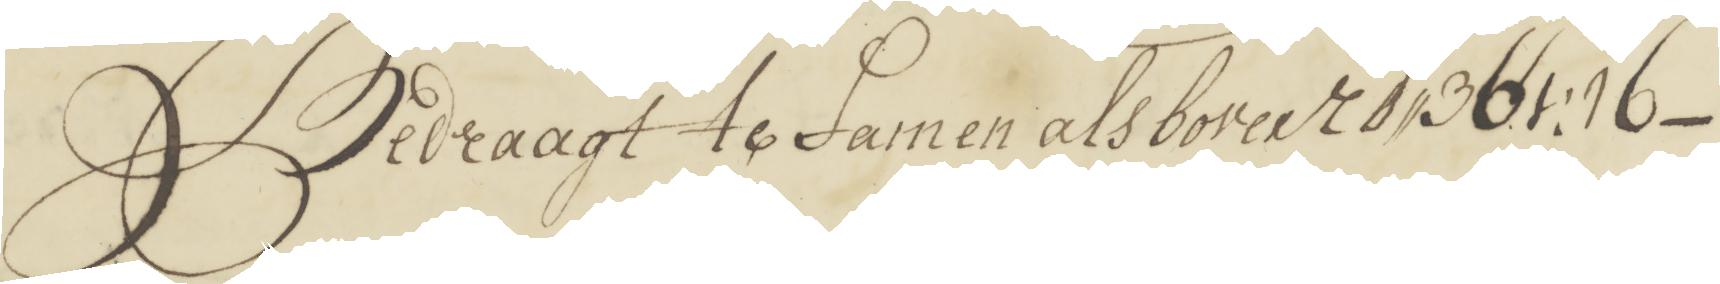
Bedraagt te samen als boven rd„s 361:16 —
